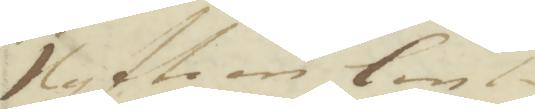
Vyftien Cent
